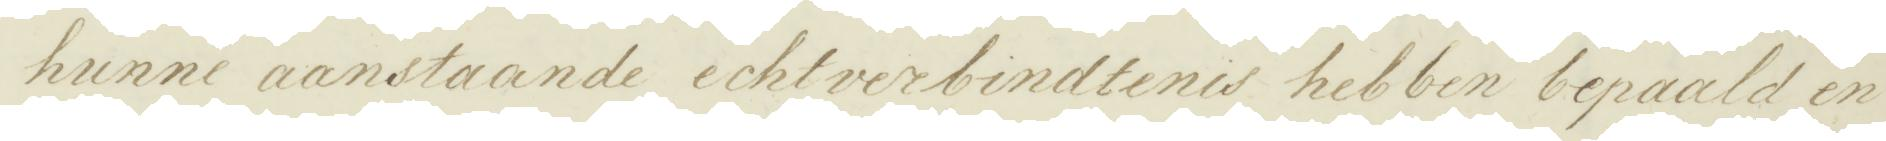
hunne aanstaande echtverbindtenis hebben bepaald en
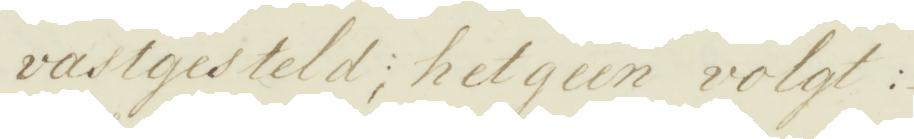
vastgesteld; hetgeen volgt:
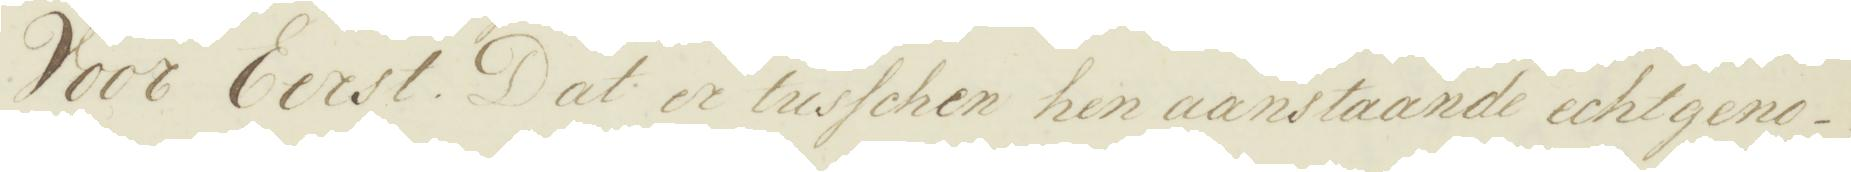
Voor Eerst. Dat er tusschen hen aanstaande echtgeno-
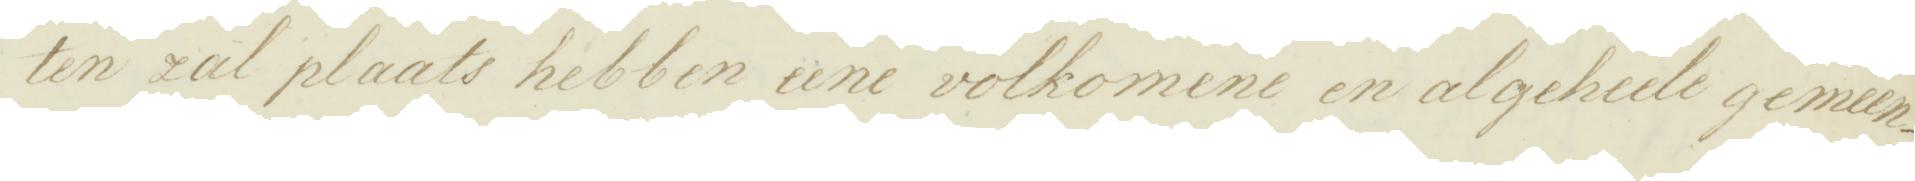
ten zal plaats hebben eene volkomene en algeheele gemeen
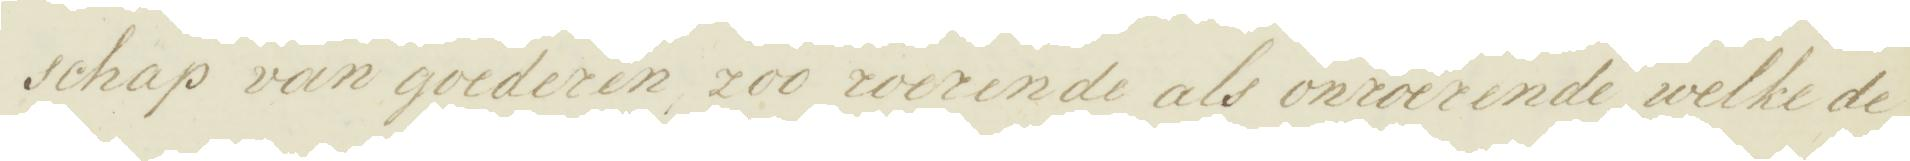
schap van goederen, zoo roerende als onroerende, welke de
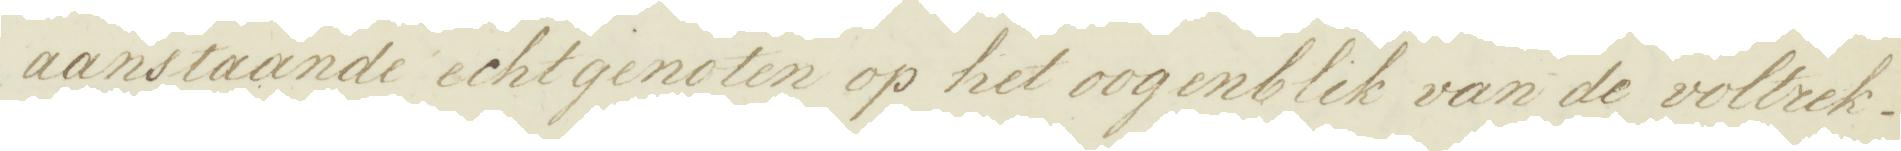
aanstaande echtgenoten op het oogenblik van de voltrek-
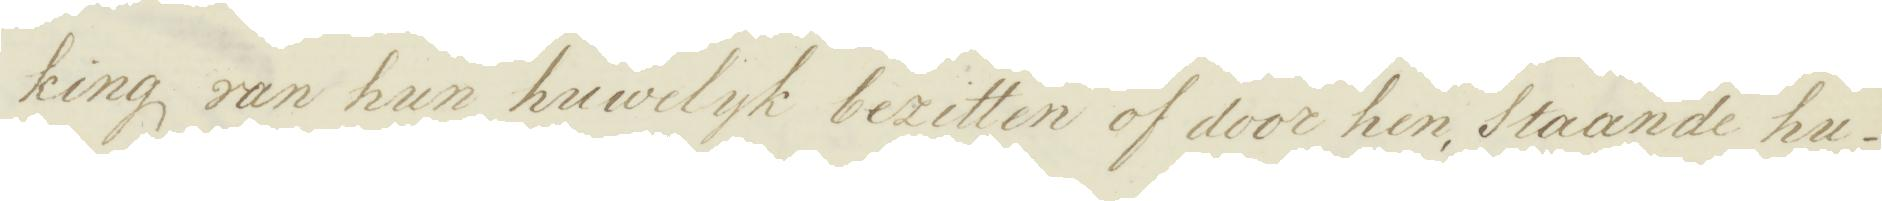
king van hun huwelyk bezitten of door hen, staande hu-
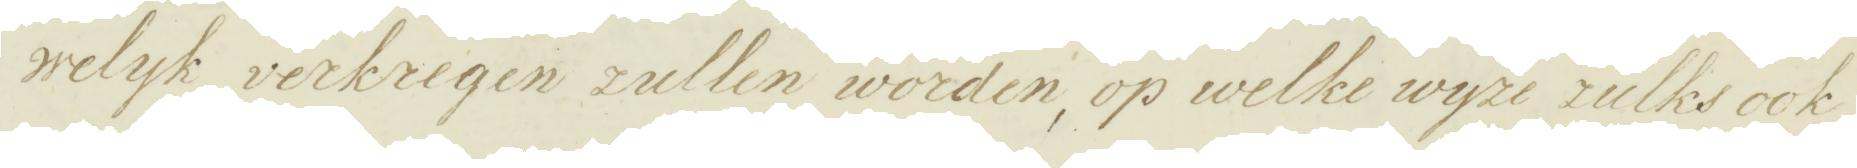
welyk, verkregen zullen worden, op welke wyze zulks ook
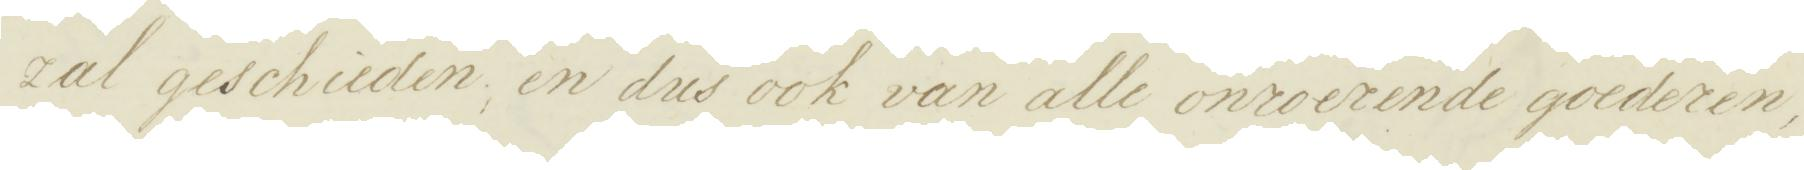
zal geschieden, en dus ook van alle onroerende goederen
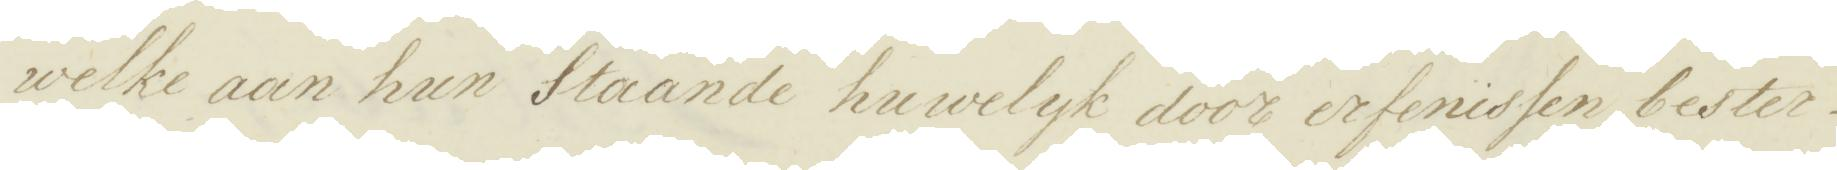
welke aan hun staande huwelyk door erfenissen bester
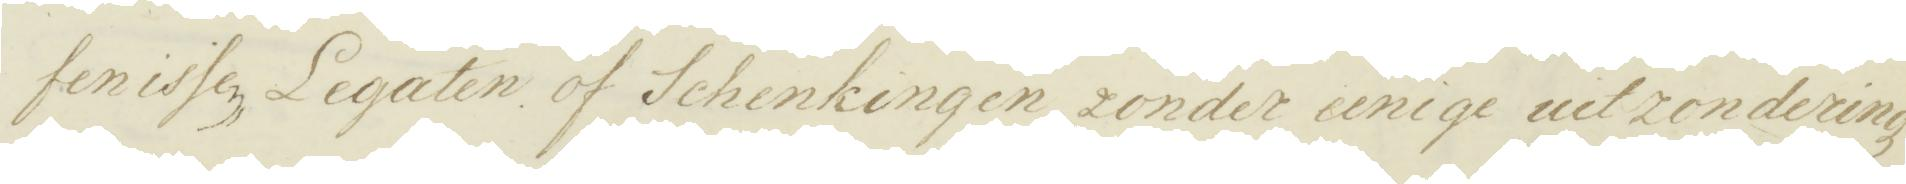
fenissen, Legaten, of schenkingen, zonder eenige uit zonderin
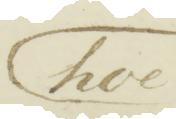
hoe
